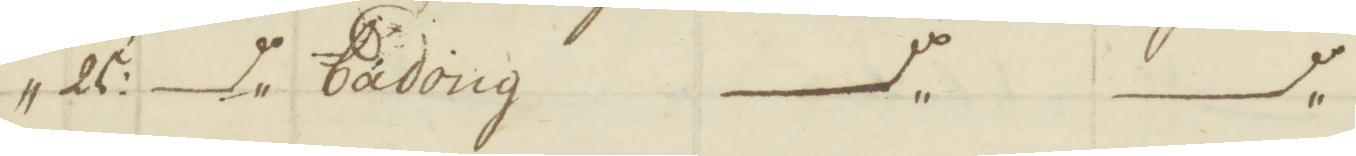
„ 25:en _„o badong _„o _„o
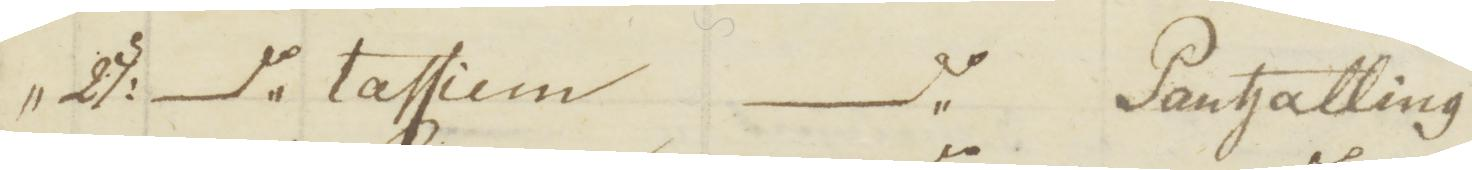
„ 27:en _„o tassien _„o Pantjalling
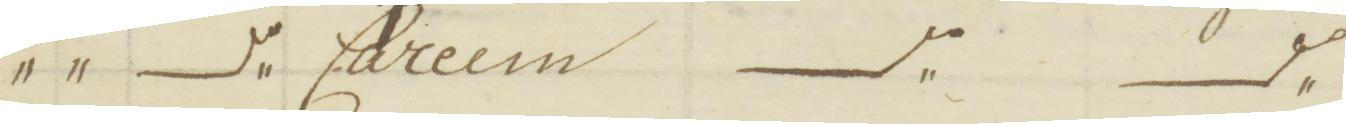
„ „ _„o Careem _„o _„o
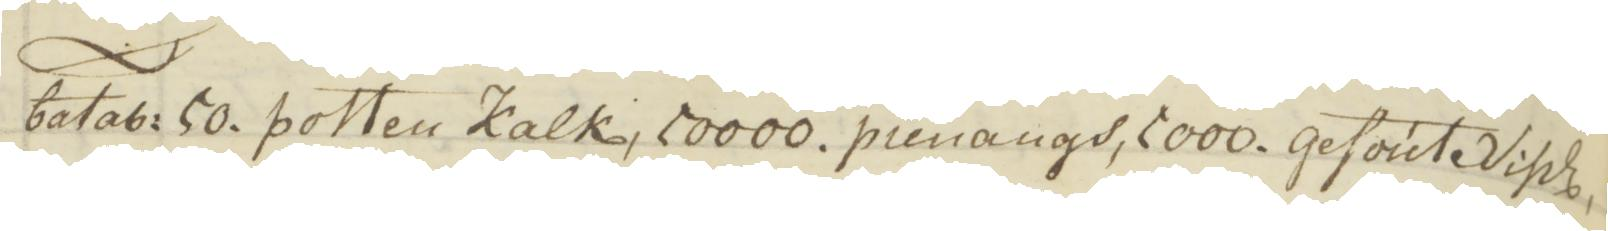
batav: 50. potten Kalk, 50000. pienangs, 5000. gesoute Visch,
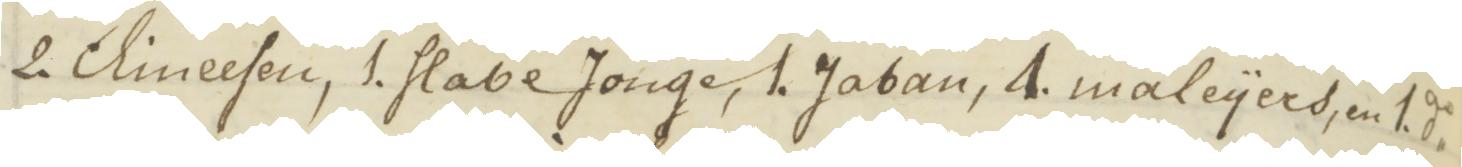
2. Chineesen, 1. slave jonge, 1. Javan, 4. maleijers, en 1. d„o
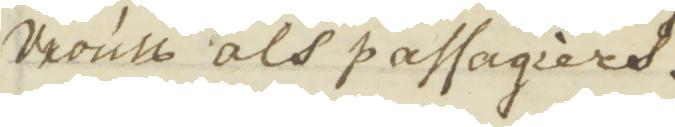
vrouw als passagiers
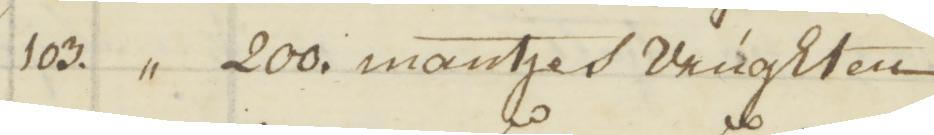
103. „ 200. mantjes Vrughten
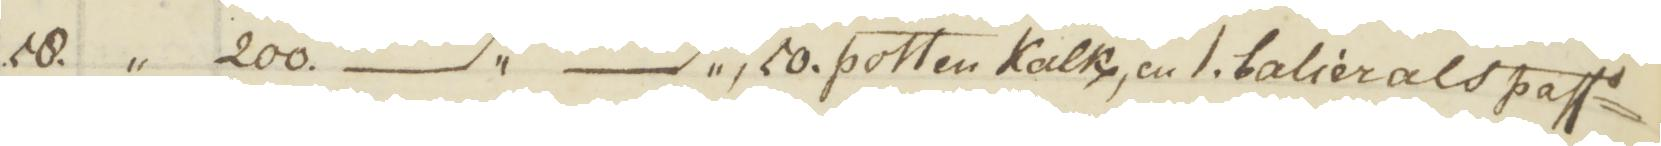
58. „ 200. _„o _„o, 50. potten Kalk, en 1. balier als pass=s
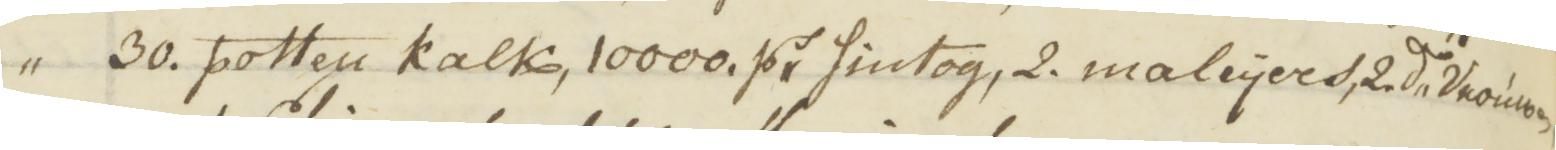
„ 30. potten kalk, 10000. p„s sintog, 2. maleijers, 2. d„o Vrouwen
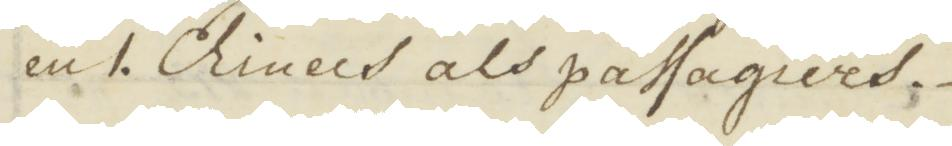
en 1. Chinees als passagiers.
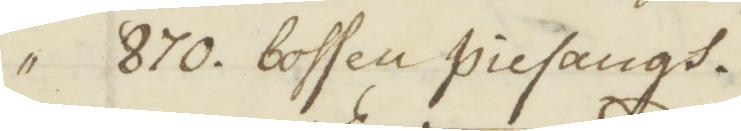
„ 870. bossen piesangs.
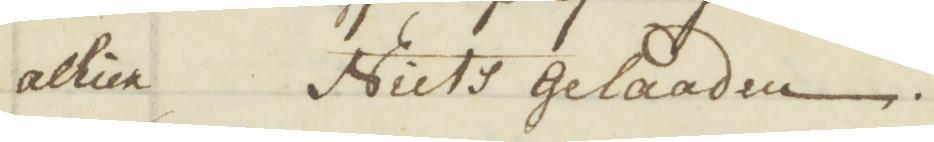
alhier Niets gelaaden.
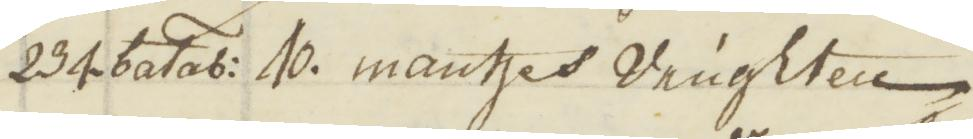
234. batav: 40. mantjes Vrughten
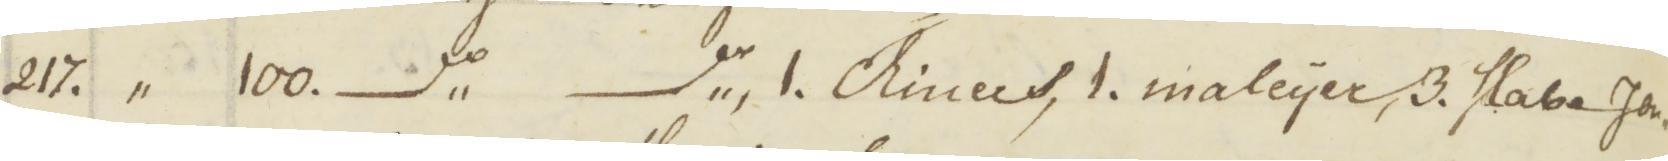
217. „ 100. _„o _„o, 1. Chinees, 1. maleijer, 3. slave jo
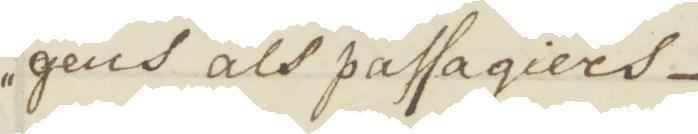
„ gens als passagiers —
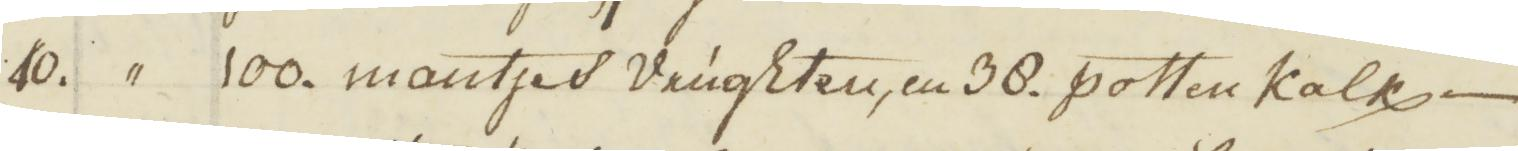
40. „ 100. mantjes Vrughten, en 38. potten Kalk —
